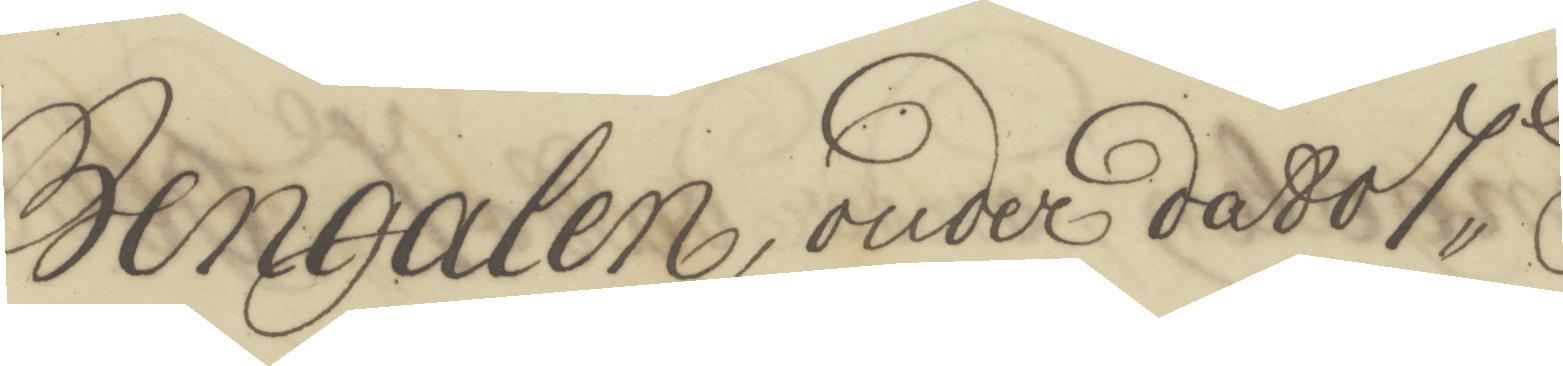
Van Bengalen, onder dato 7„e 9ber „ 1725:
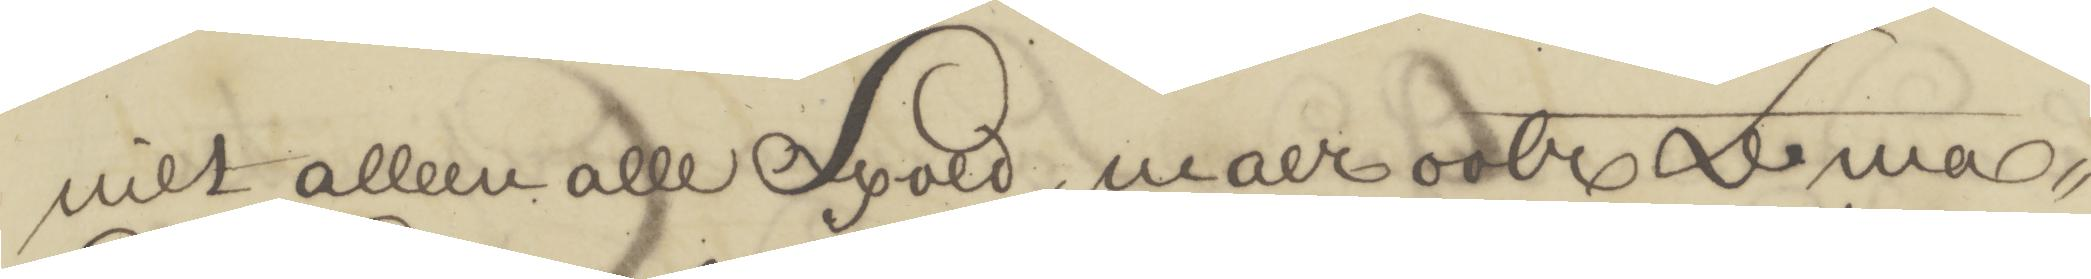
niet alleen alle spoed, maer ook te ma„
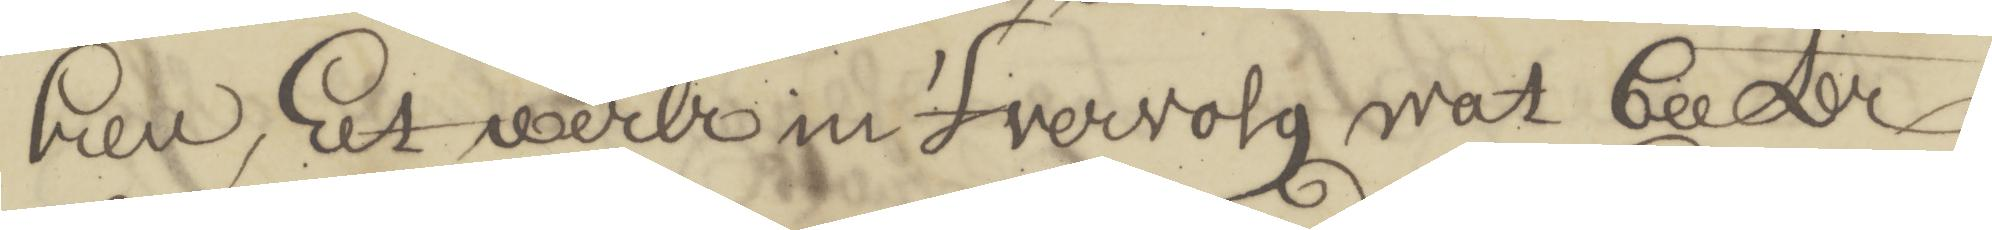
ken, het werk in ’t vervolg wat beeter
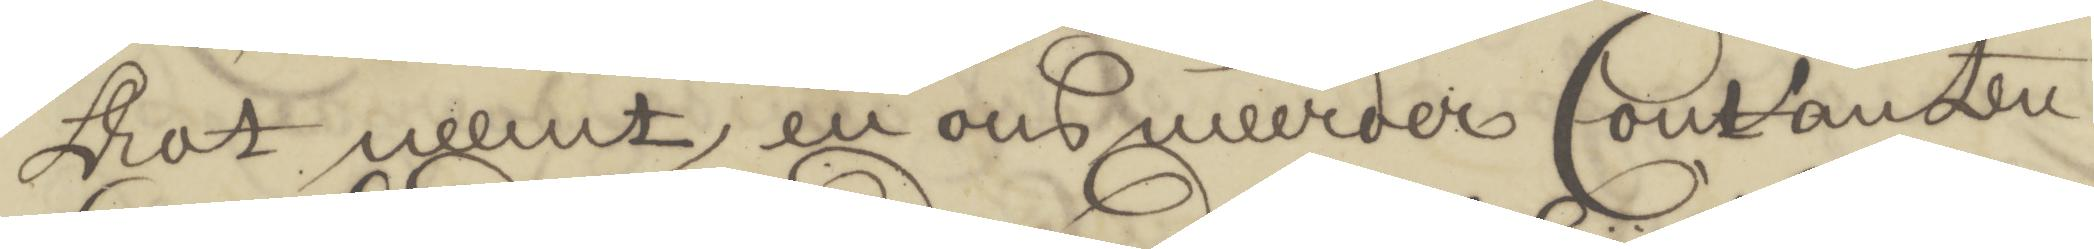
schot neemt, en ons meerder Contanten
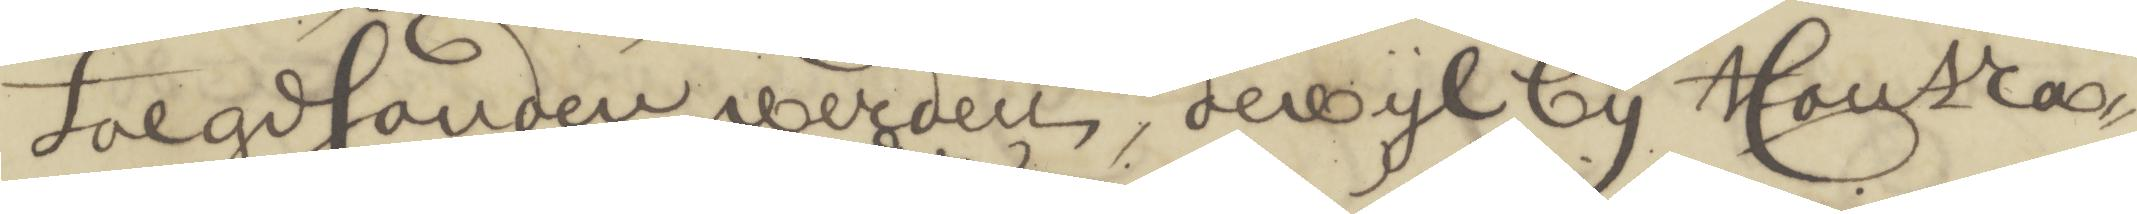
toegesonden werden, dewijl bij 'tContra„
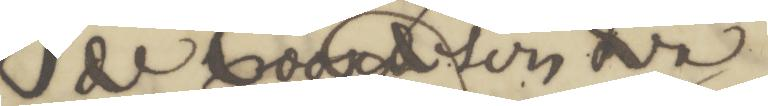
de voordelen der
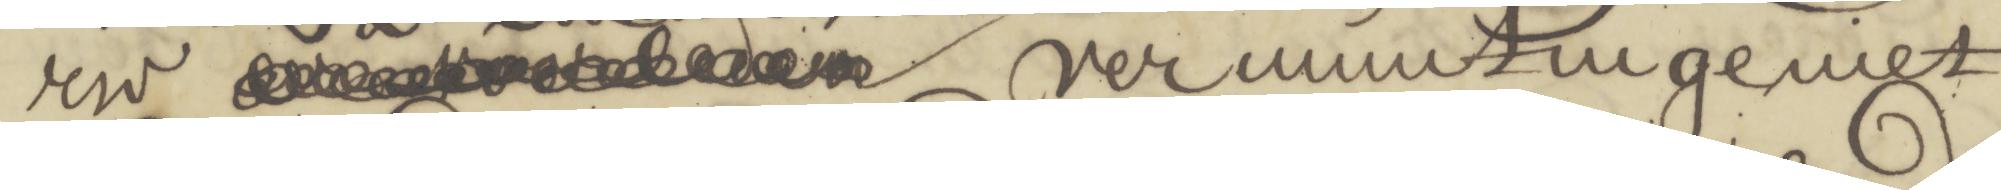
rie de voordeele den vermuntinge niet
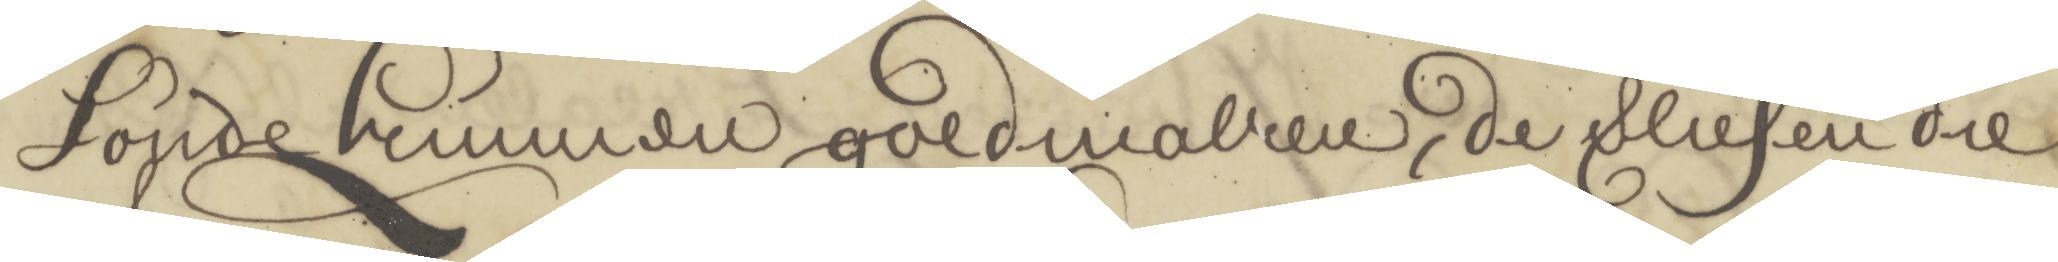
soude kunnen goedmaken, de verliesen die
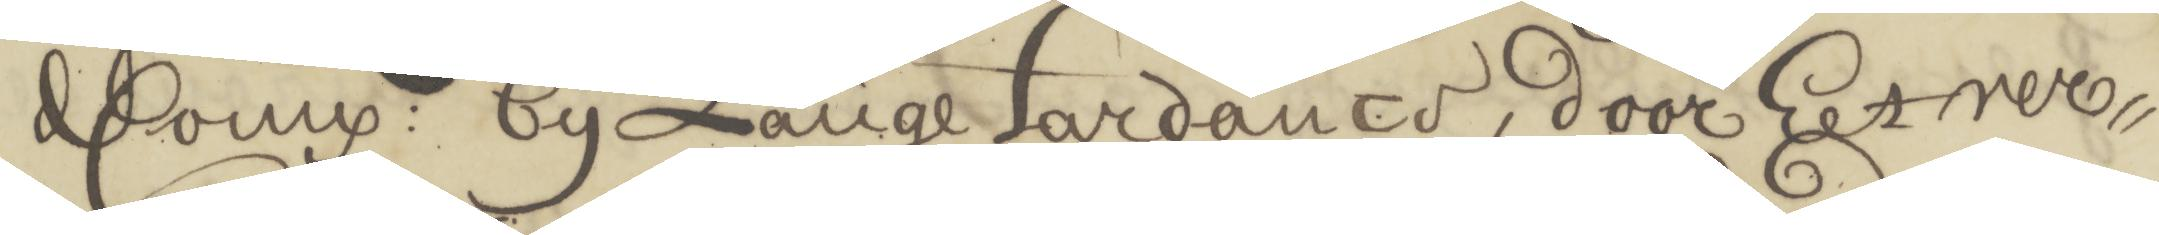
dEComp: bij Lange tardance, door het ver„
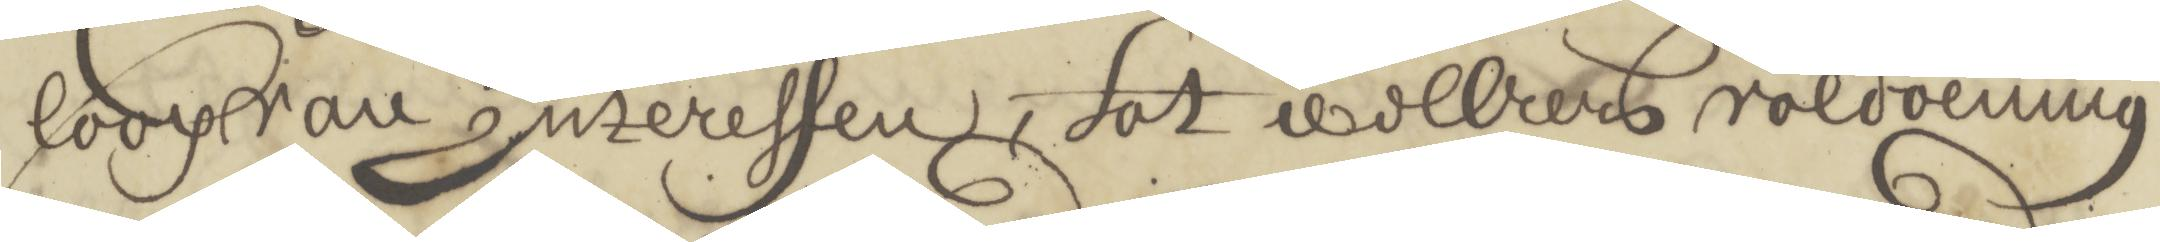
loop van jnteressen, tot welkers voldoening
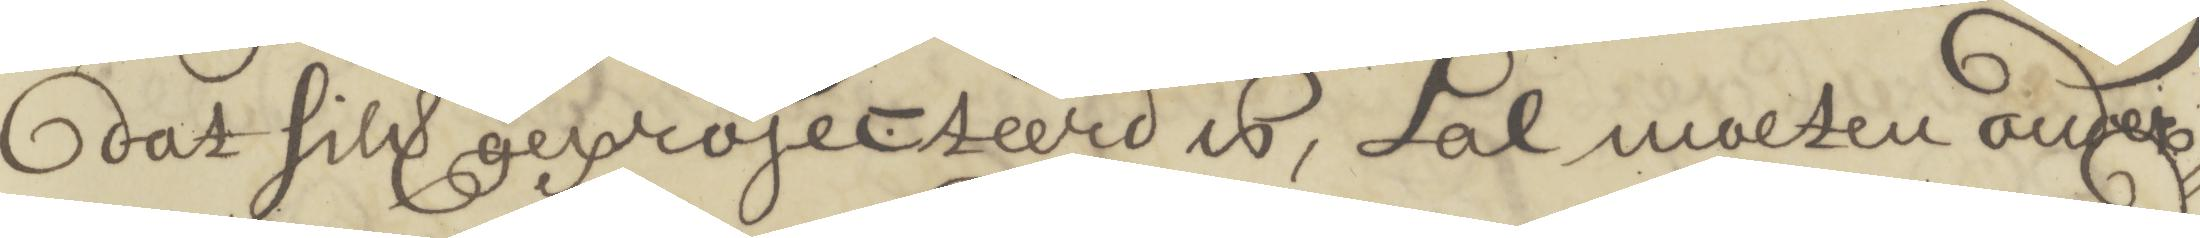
dat silver geprojecteerd is, sal moeten onder
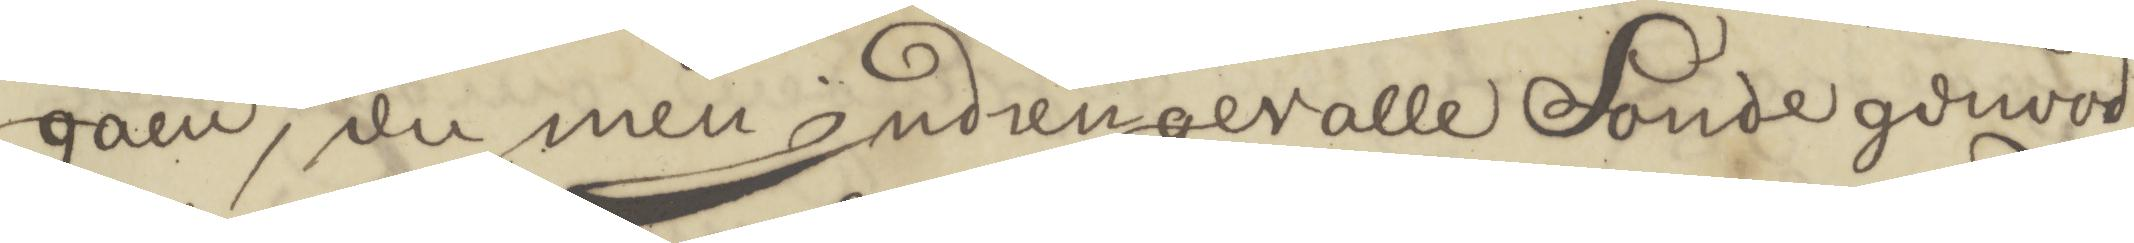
gaen, en men jndien gevalle soude genood
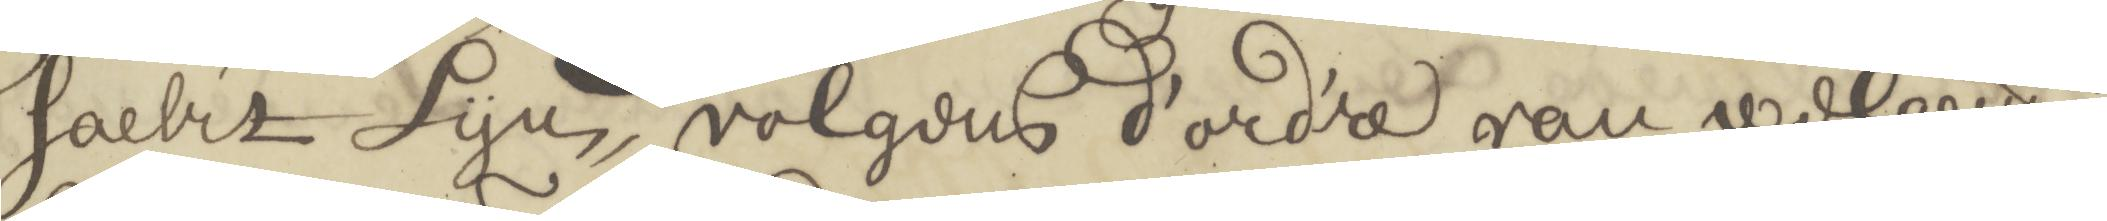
saekt sijn, volgens d'ordre van welgem:
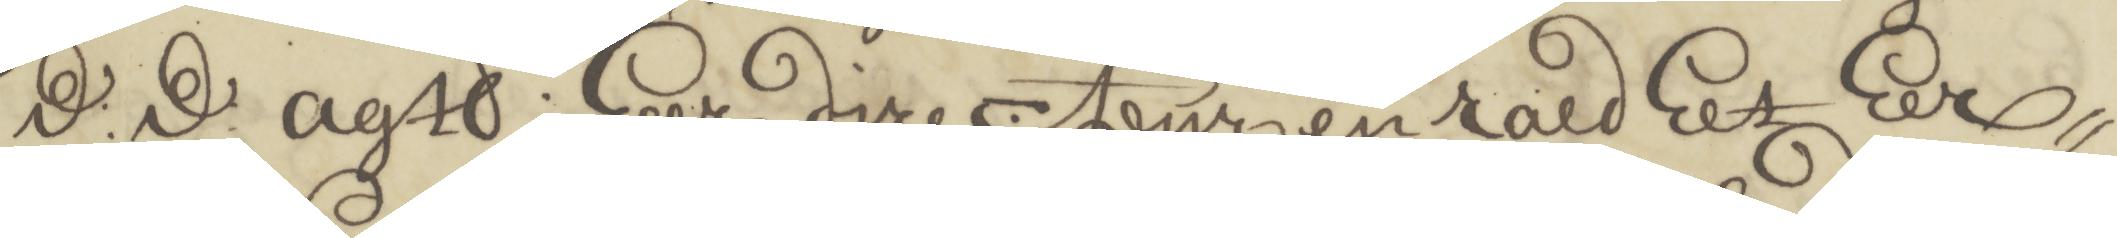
E: E: agtb: heer directeur en raed het her„
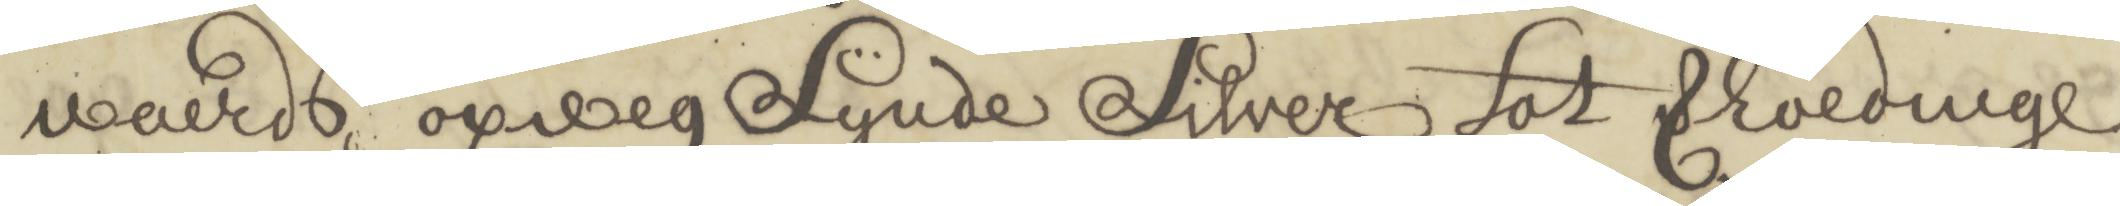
waerds: opweg sijnde silver tot verhoedinge
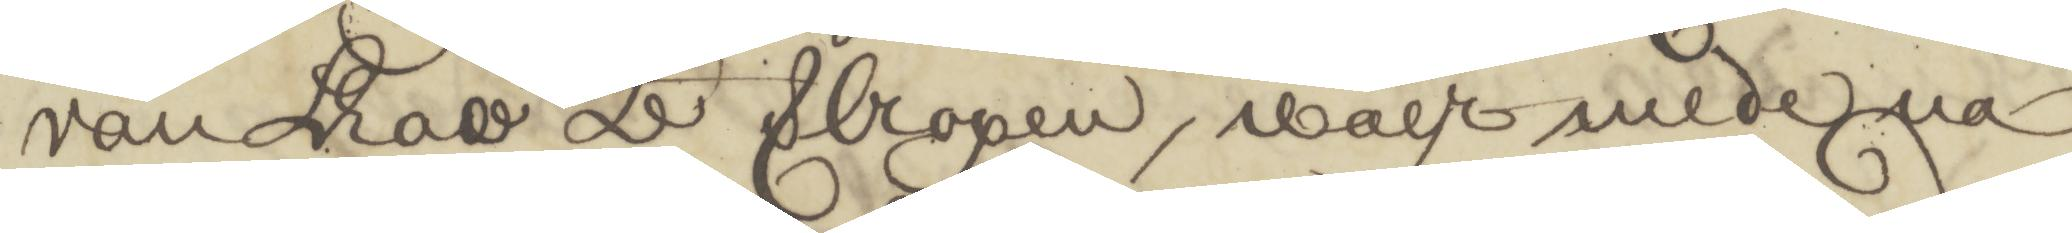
van schade te verkopen, waer mede na
